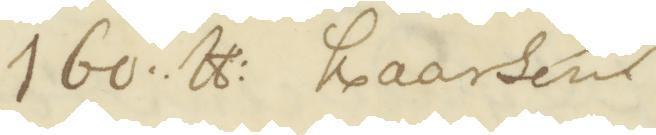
160: lb: kaarsen
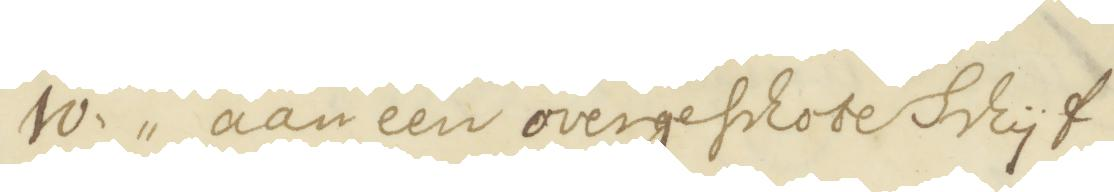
10: „ aan een overgeschote schijf
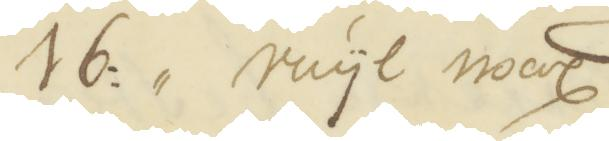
16: „ vuijl wax
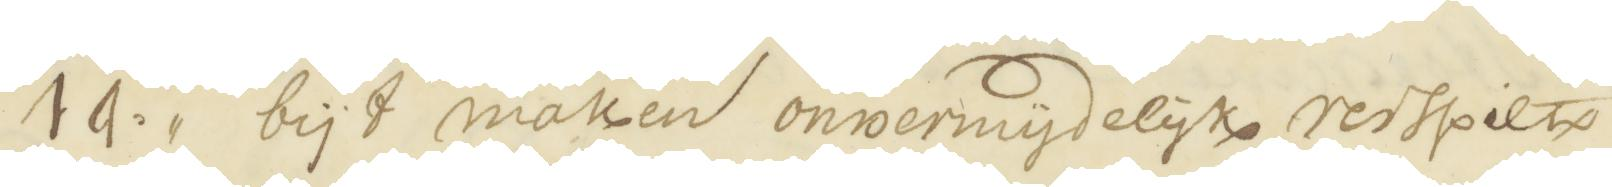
14: „ bij ’t maken onvermijdelijk verspilt
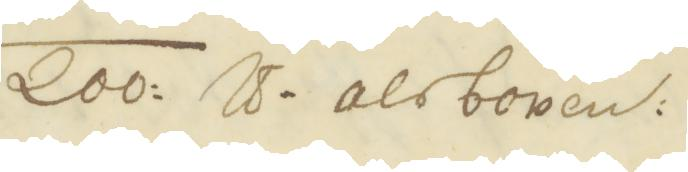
200: lb. als boven:
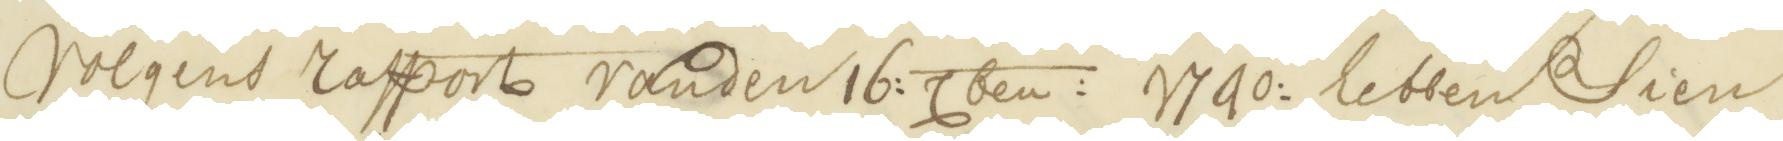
volgens rapport van den 16: xber: 1740: hebben Sien
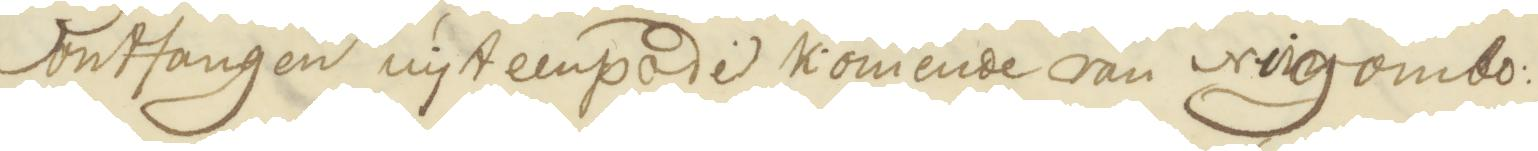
ontfangen uijt een padi komende van Nigombo:
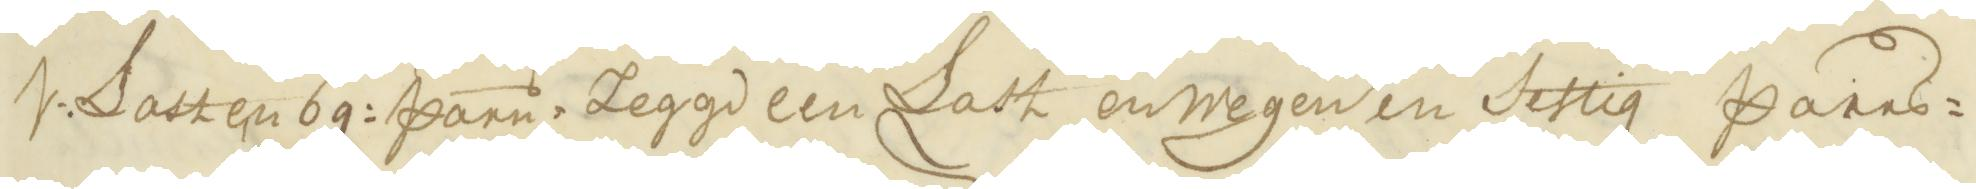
1: Lasten 69: parr:s zegge een Last en wegen en settig parrs=
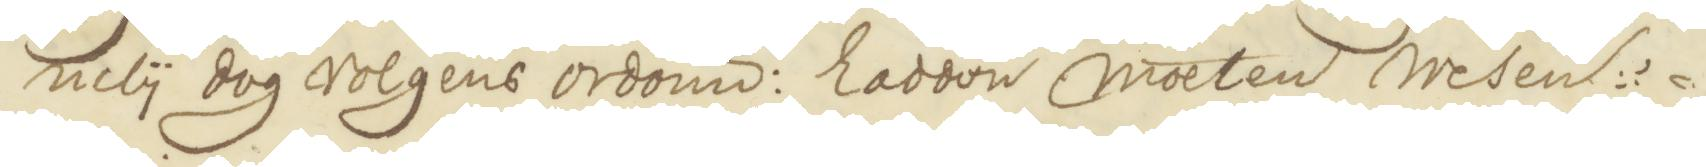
nelij dog volgens ordonn: hadden moeten wesen:: =
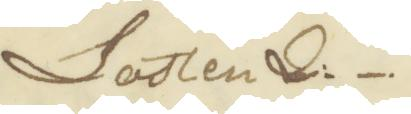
Lasten 2: –.
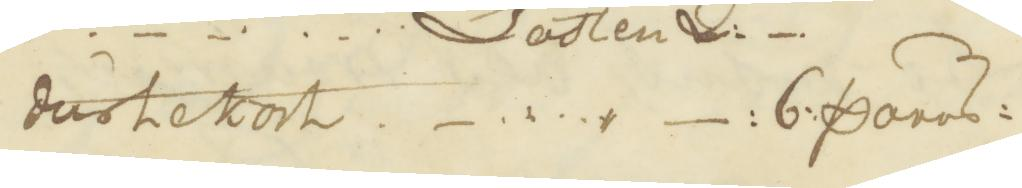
dus te kort . – . : . . „ — : 6: parrs:
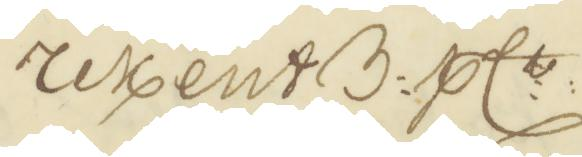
rekent 3: pC:to
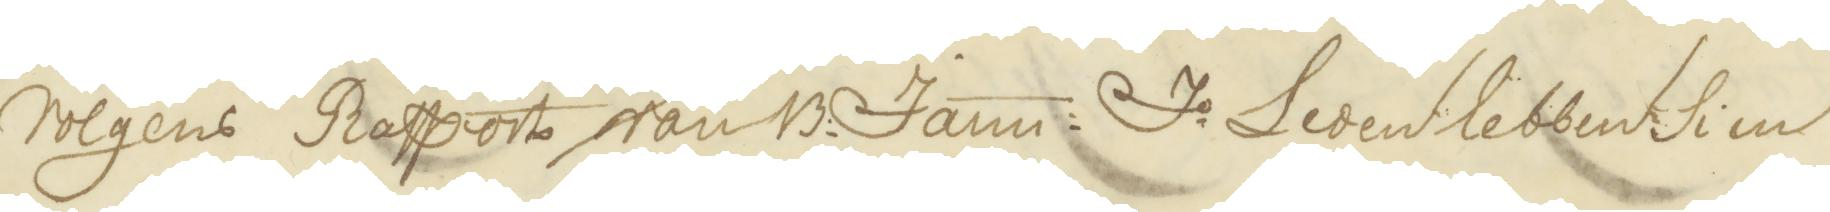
volgens Rapport van 13: Iann: I„o Leden hebben sien
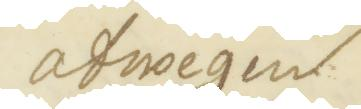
afwegen
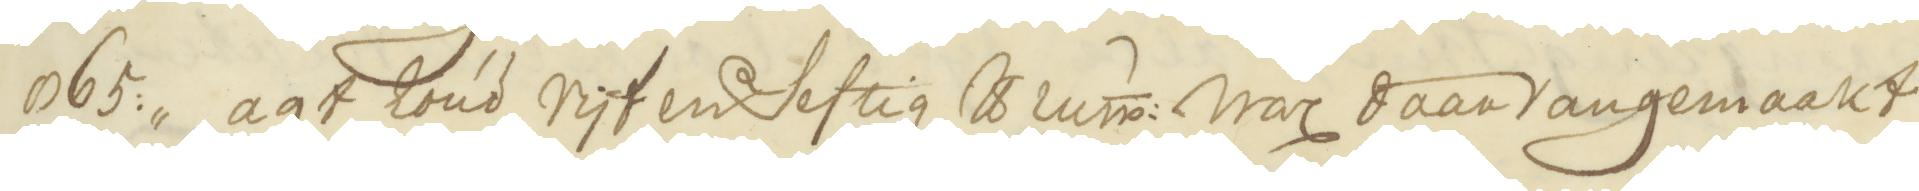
865: „ agt hon'd vijf en sestig 28 ruw: wax daar van gemaakt
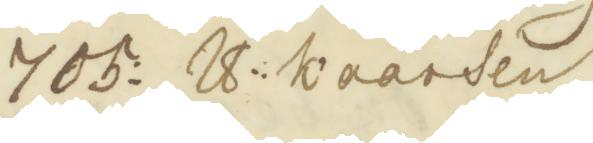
705: 28: kaarsen
